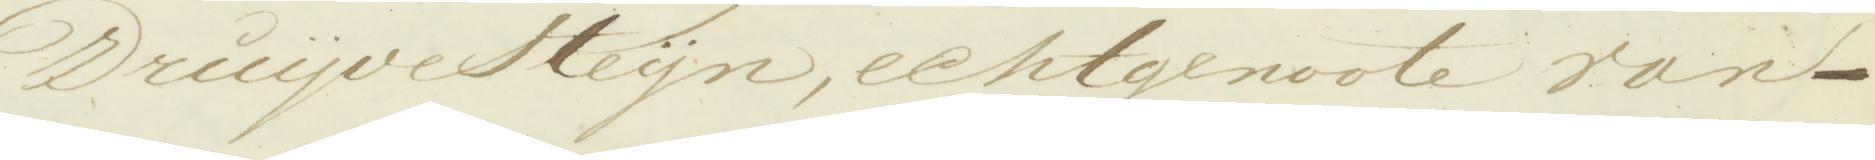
Druijvesteijn, echtgenoote van-
